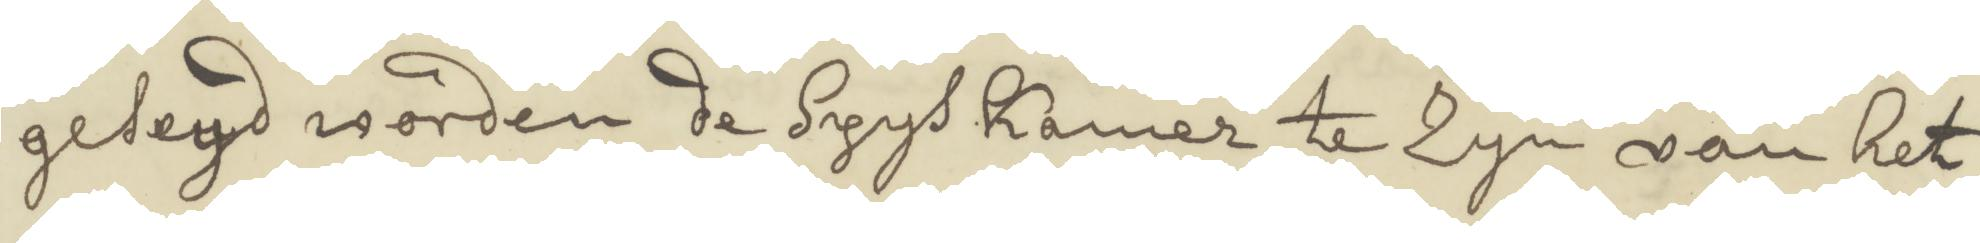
geseyd worden de spyskamer te zyn van het
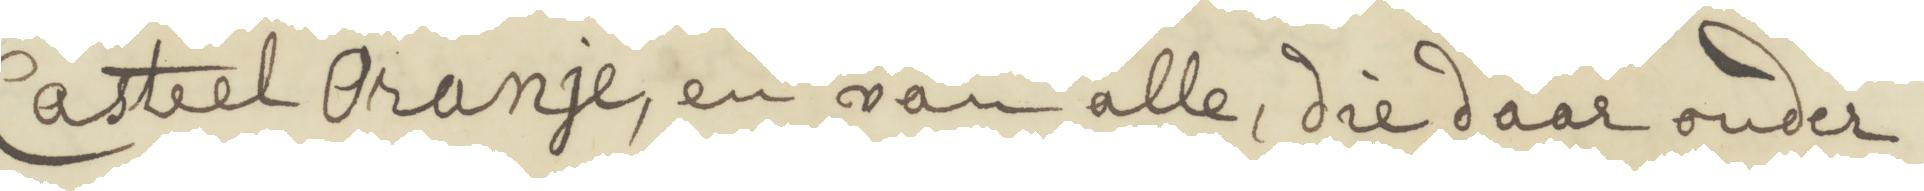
Casteel oranje, en van alle, die daar onder
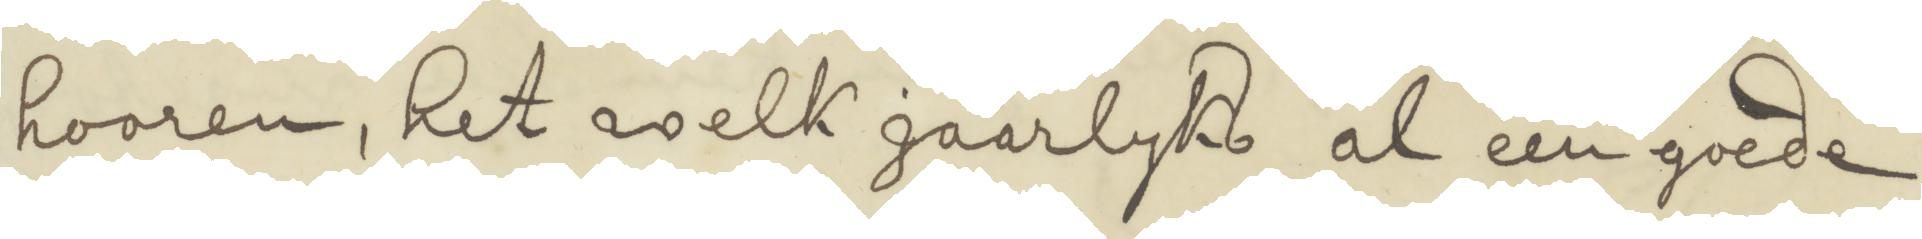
hooren, het welk jaarlyks al een goede
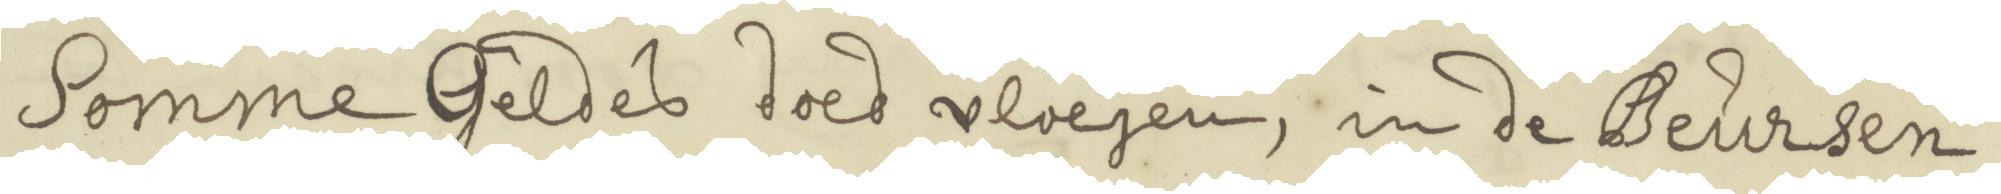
Somme geldes doed vloejen, in de Beursen
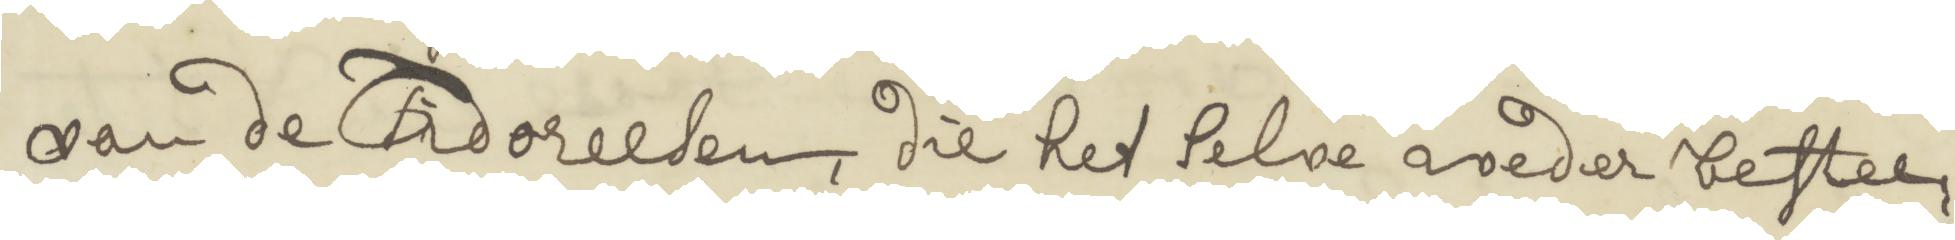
van de Tidoreesen, die het selve weder bestee
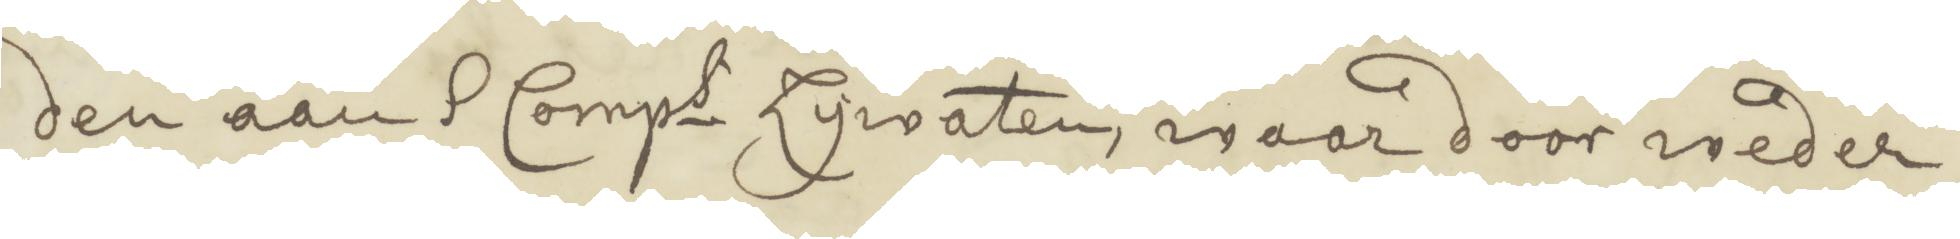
den aan s Comp–s Lijwaten, waar door weder
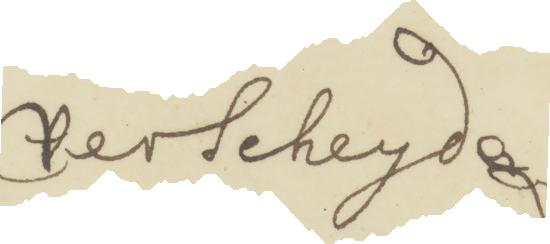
verscheyde
